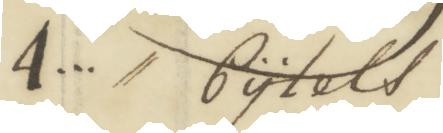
4.-. „ bijtels
